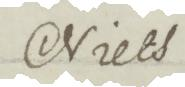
Niets
